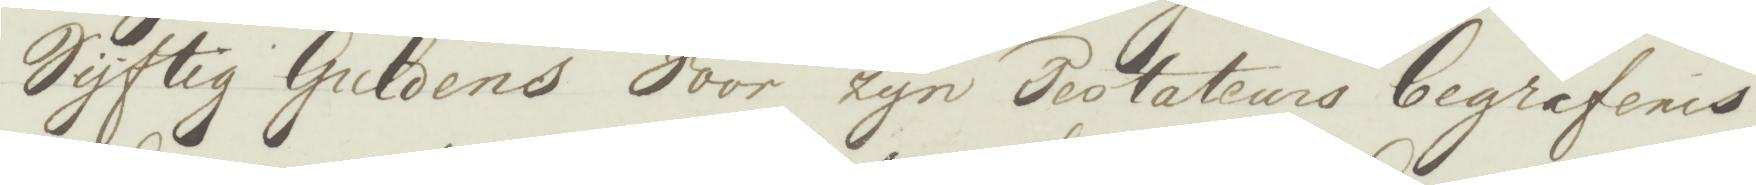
Vijftig Guldens voor zijn Testateurs begrafenis
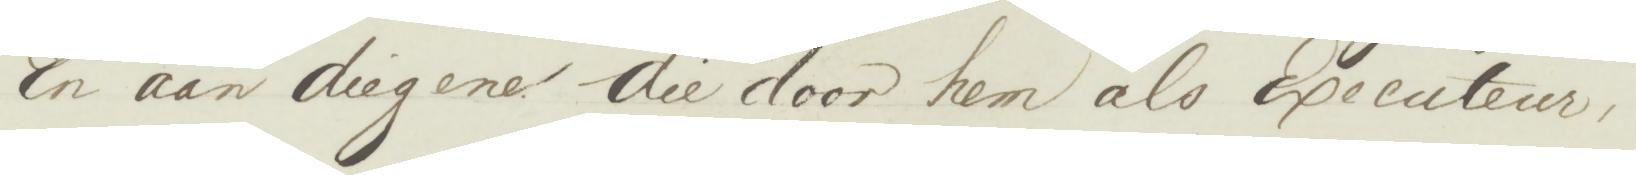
En aan diegene die door hem als Executeur,
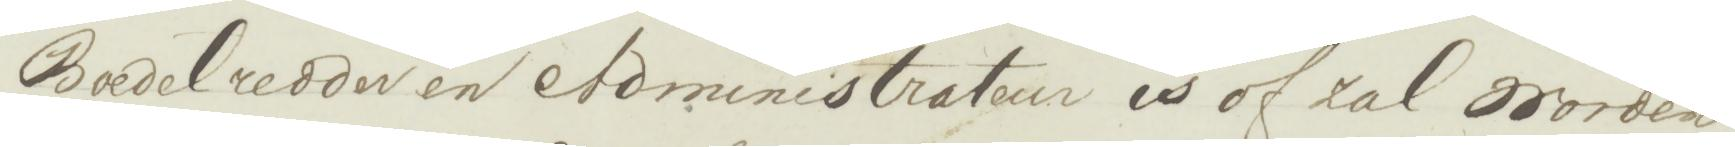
Boedelredder en Administrateur is of zal worden
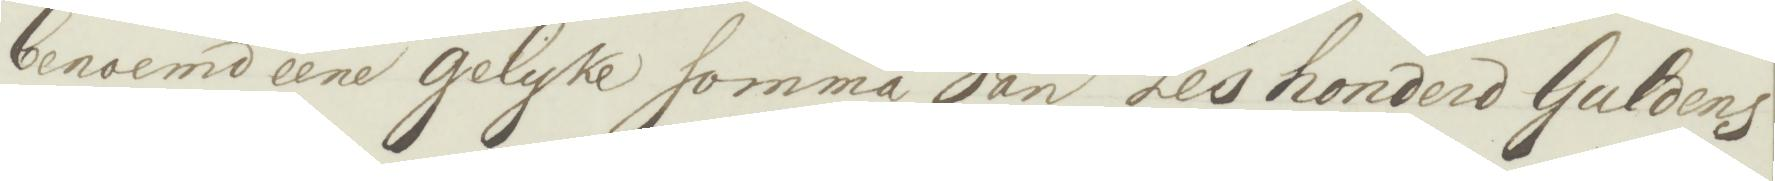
benoemd eene gelijke somma van Zes honderd Guldens
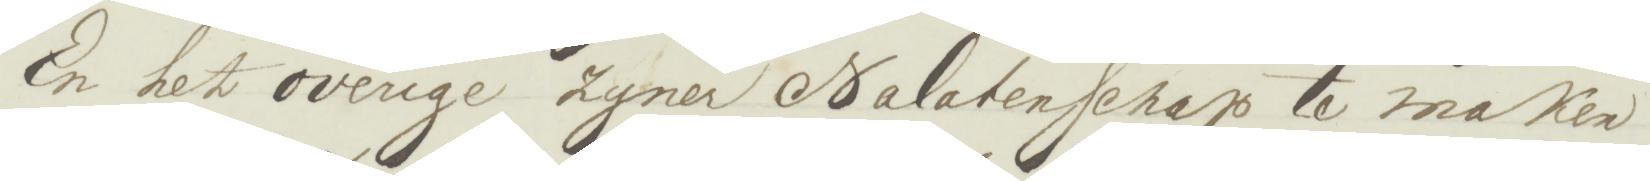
En het overige zyner Nalatenschap te maken
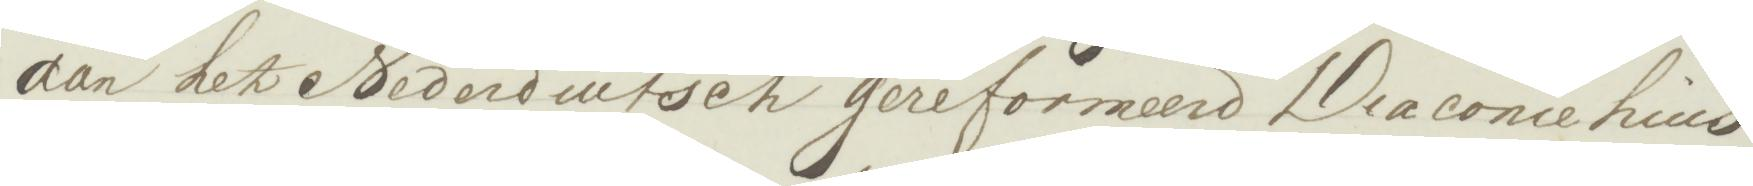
aan het Nederduitsch gereformeerd Diaconie huis
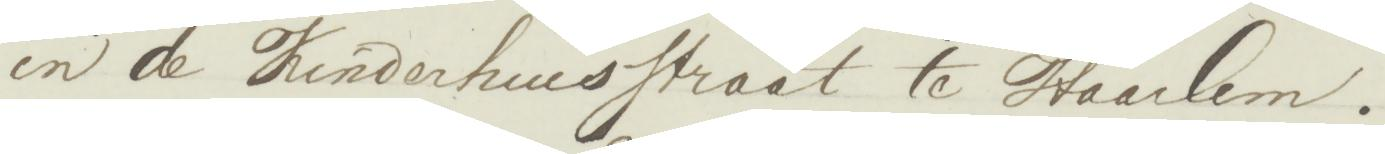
in de Kinderhuisstraat te Haarlem.
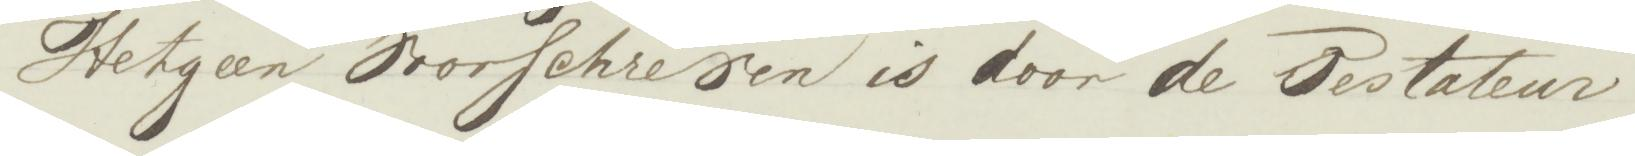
Hetgeen voorschreven is door de Testateur
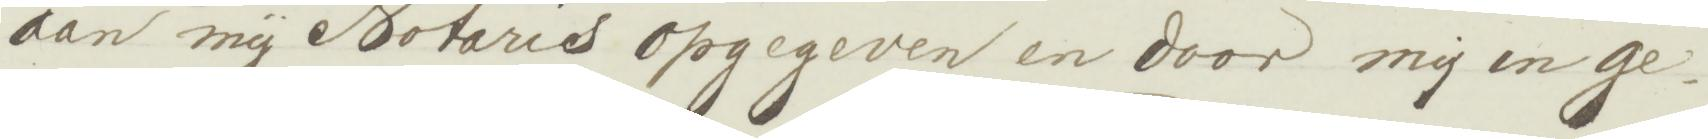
aan mij Notaris opgegeven en door mij in ge-
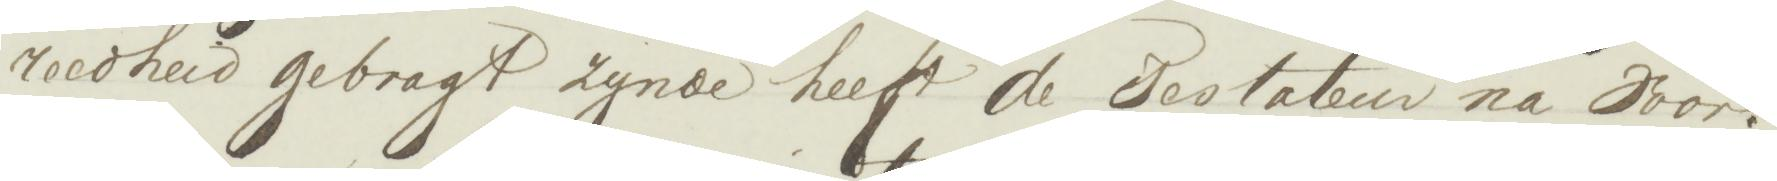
reedheid gebragt zijnde heeft de Testateur na voor.
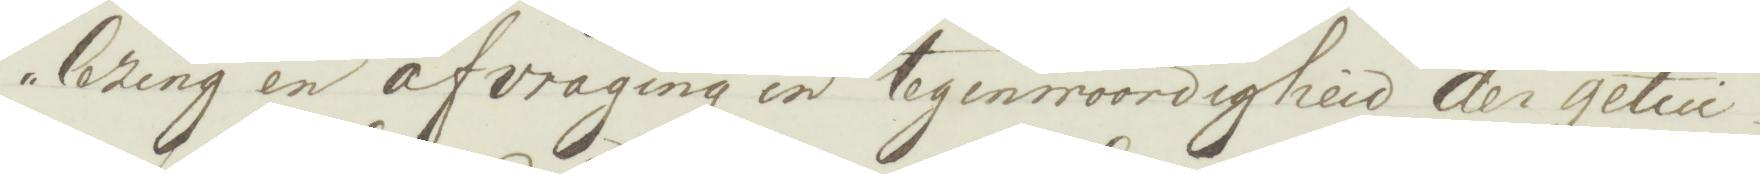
„lezing en afvraging in tegenwoordigheid der getui
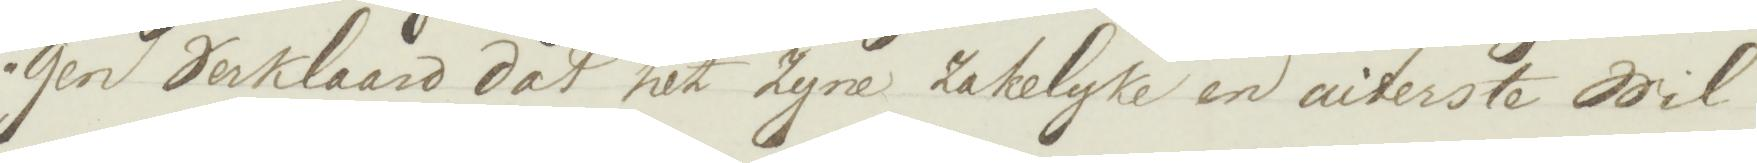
„gen verklaard dat het zyne zakelyke en uiterste wil
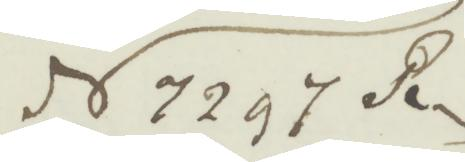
N 7297 R
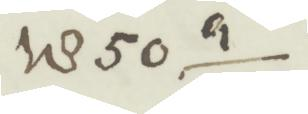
1850 9/17
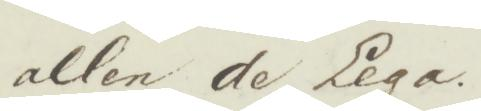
allen de Lega.
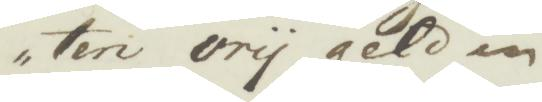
„ten vrij geld en
